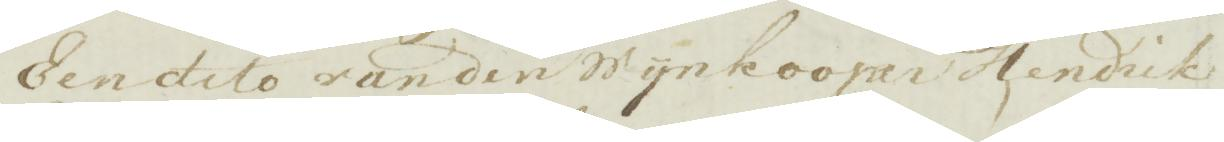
Een dito van den wijnkooper Hendrik
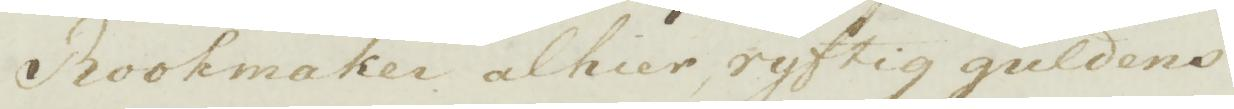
Rookmaker alhier, vyftig guldens
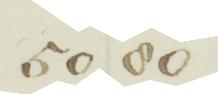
50 80
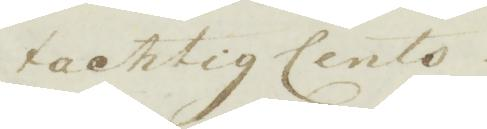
tachtig Cents - - - - - - - - - - - - - - -
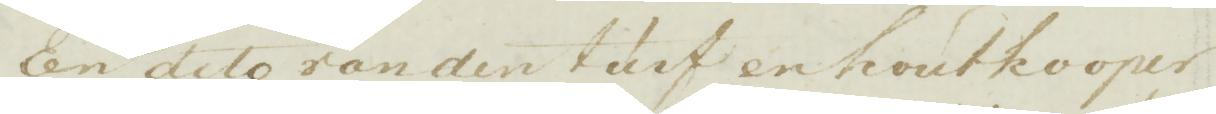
Een dito van den turf en houtkooper
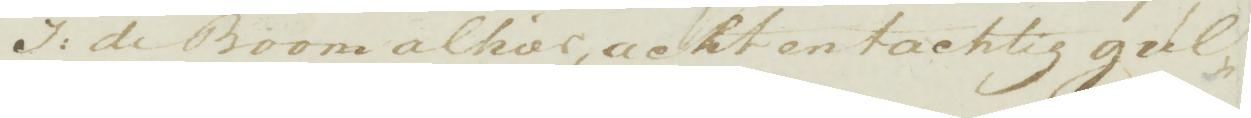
J: de Boom alhier, acht en tachtig gul„
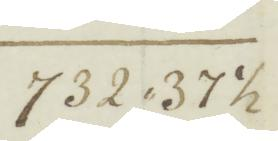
ƒ 732 „ 37½
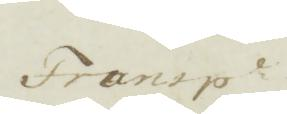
Transp=e
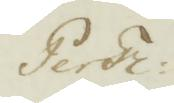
PerTr:
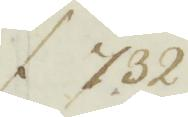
ƒ 732 37½
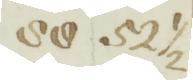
88 52½
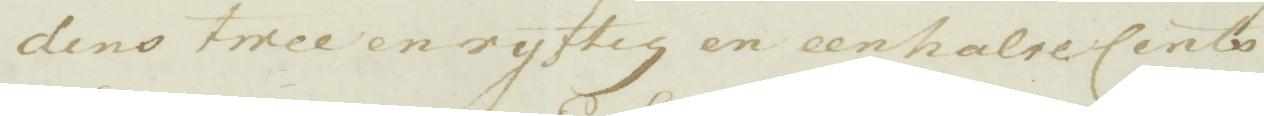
dens twee en vyftig en een halve Cents
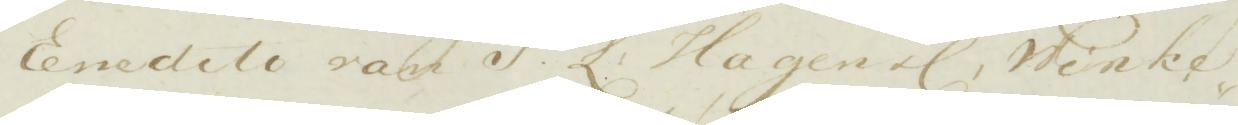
Eene dito van P. L. Hagen & ,, Winke„
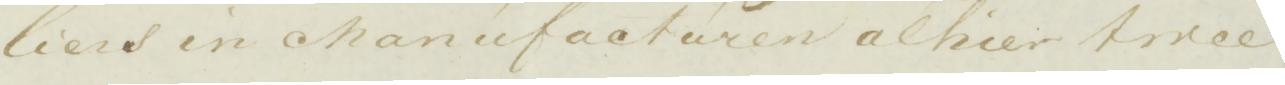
liers in Manufacturen alhier twee
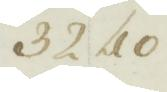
32 40
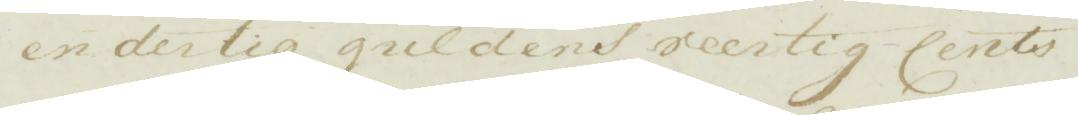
en dertig guldens veertig Cents - - - -
